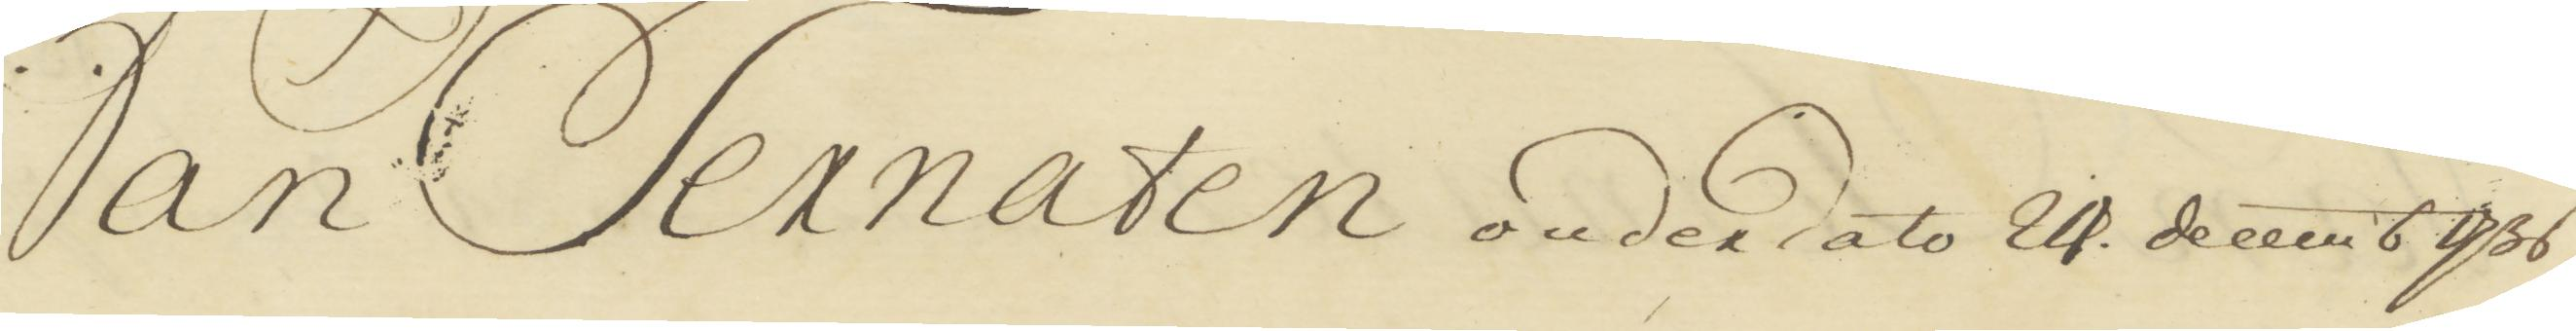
Van Ternaten onder dato 24. decemb 1736
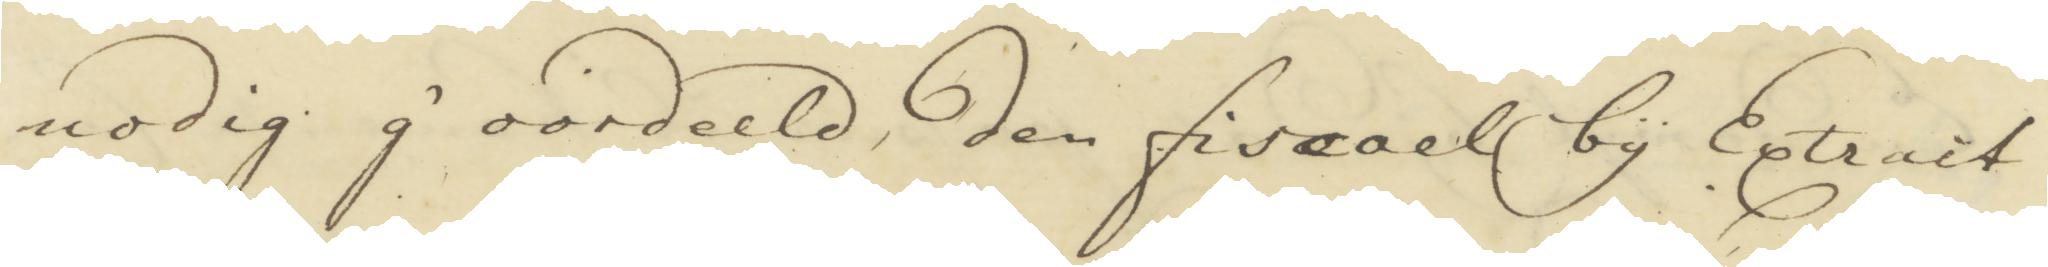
nodig g’oordeeld, den fiscael bij Extract
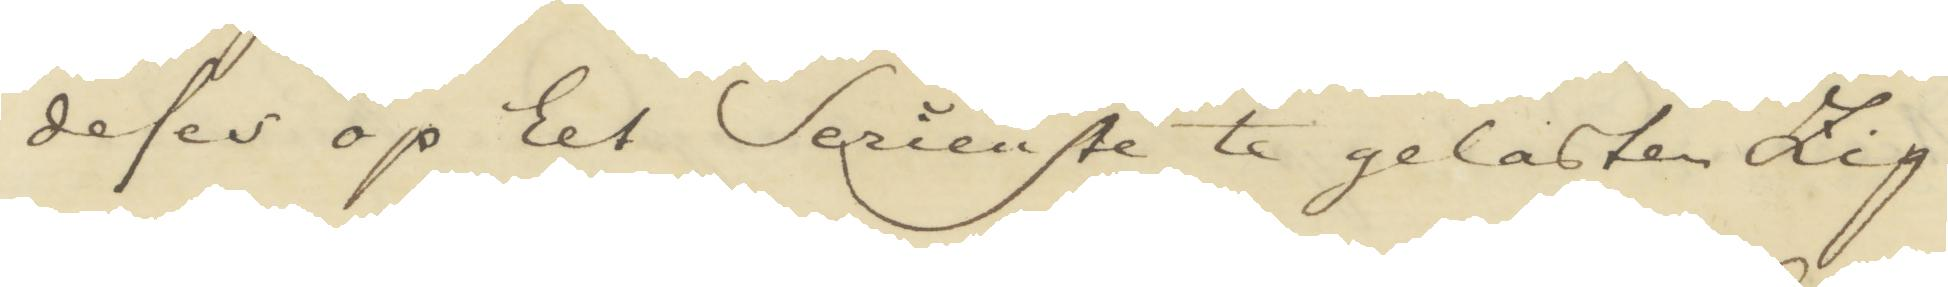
deses op het Serieuste te gelasten zig
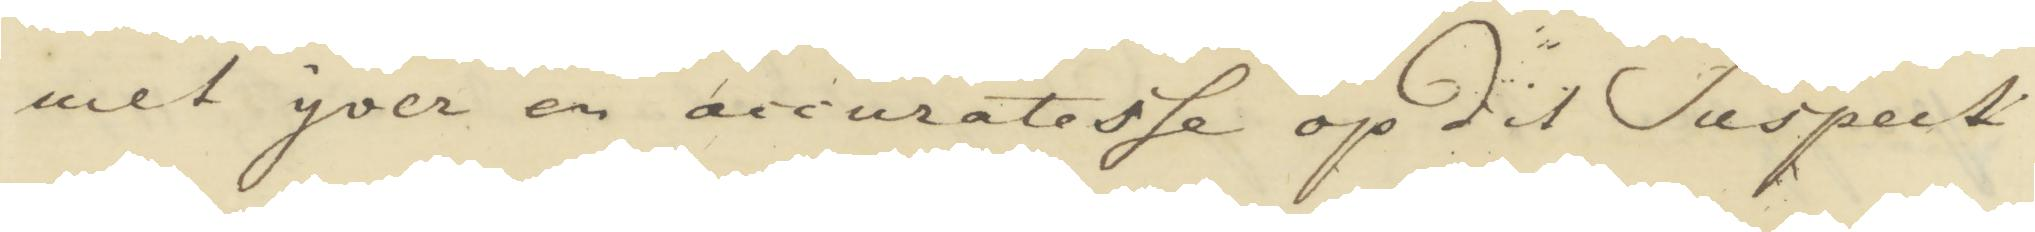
met ijver en accuratesse op dit Suspect
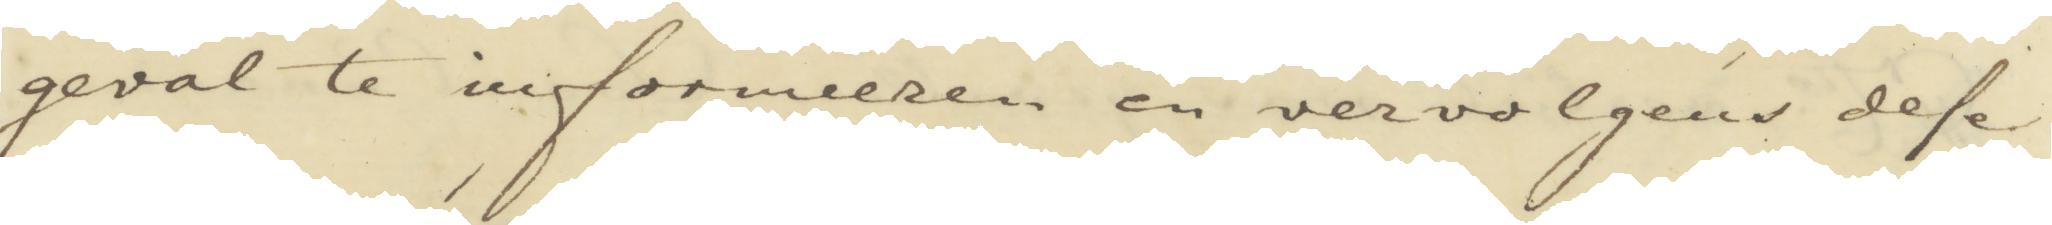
geval te informeeren en vervolgens dese
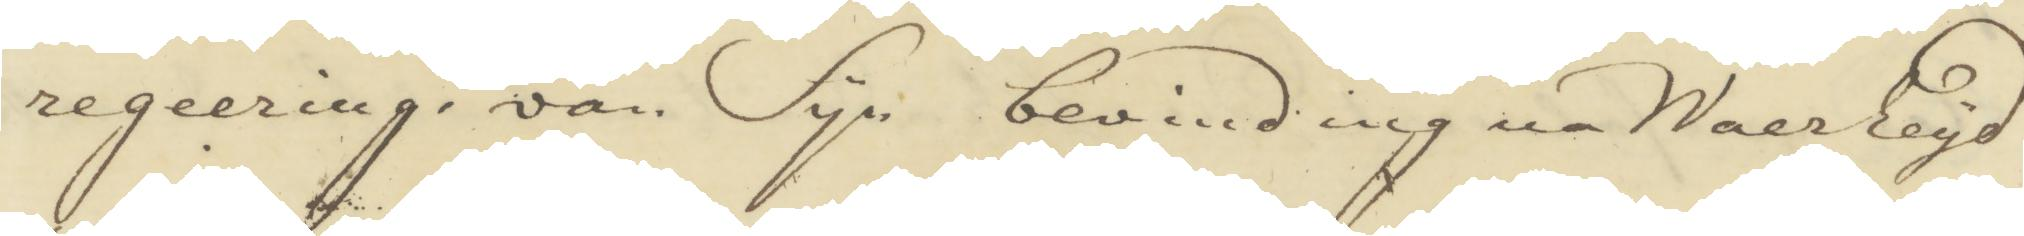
regeering van sijn bevinding na Waerheijd
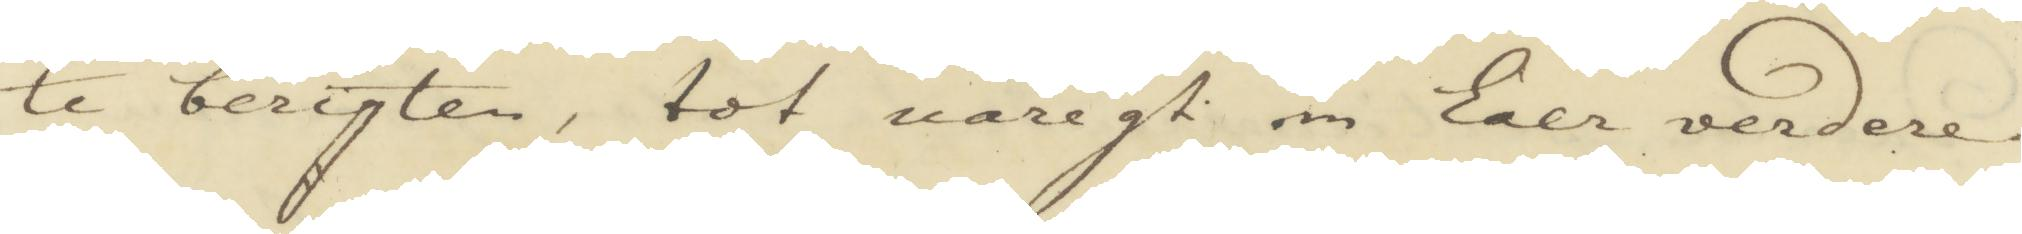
te berigten, tot naregt in haer verdere
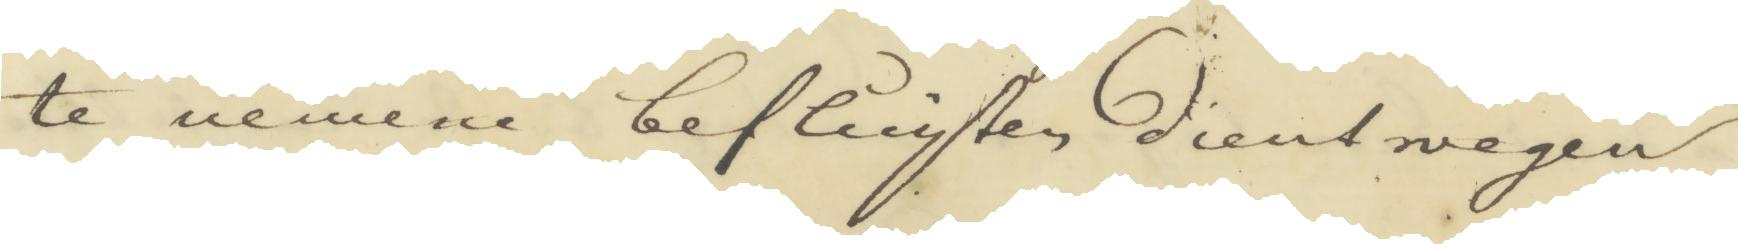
te nemene besluijten dient wegen
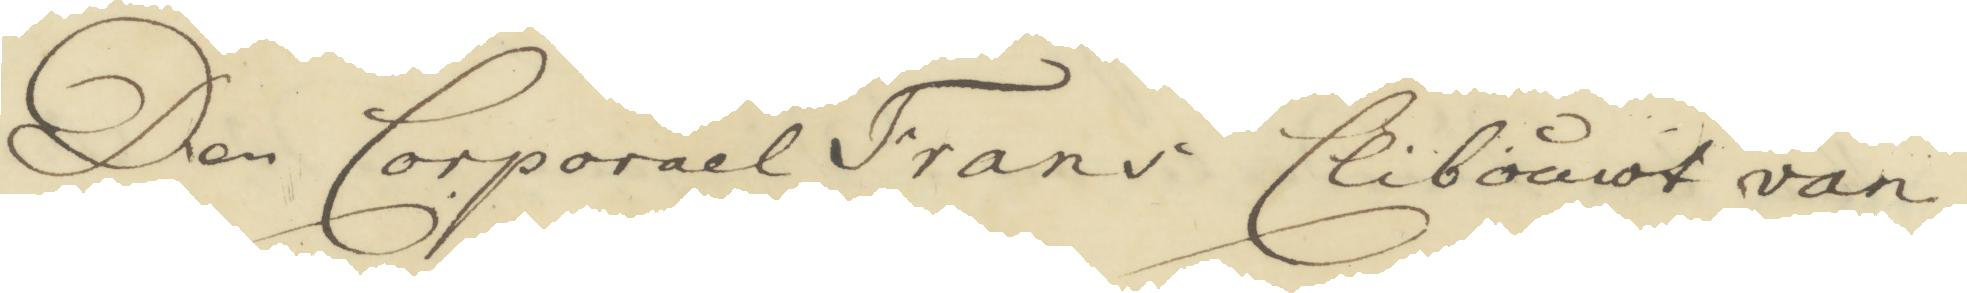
Den Corporael Frans Clibouwt van
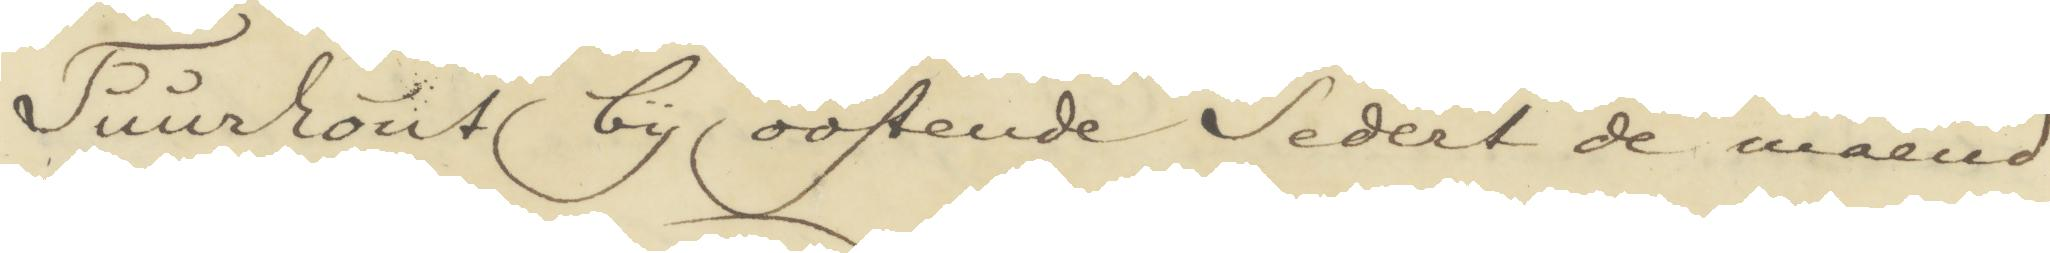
Tuurhout bij oostende sedert de maend
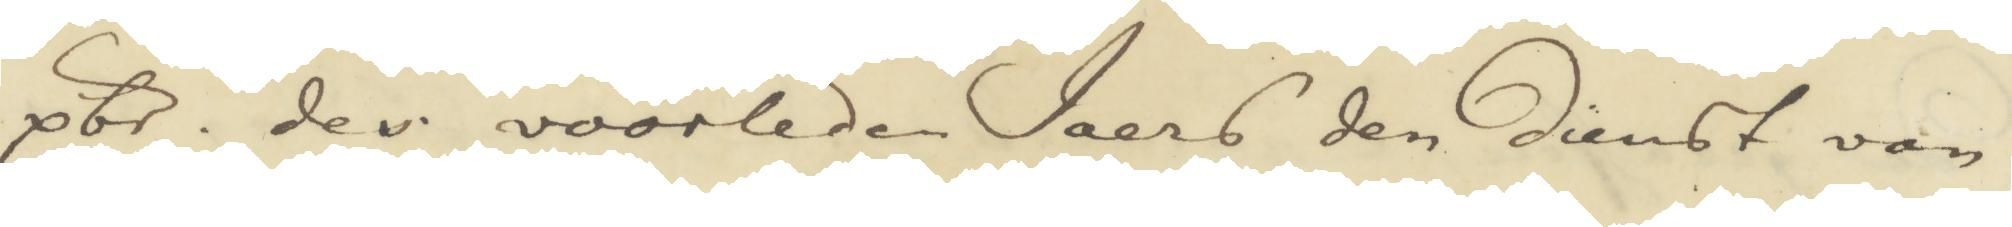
xbr. des voorleden Iaers den dienst van
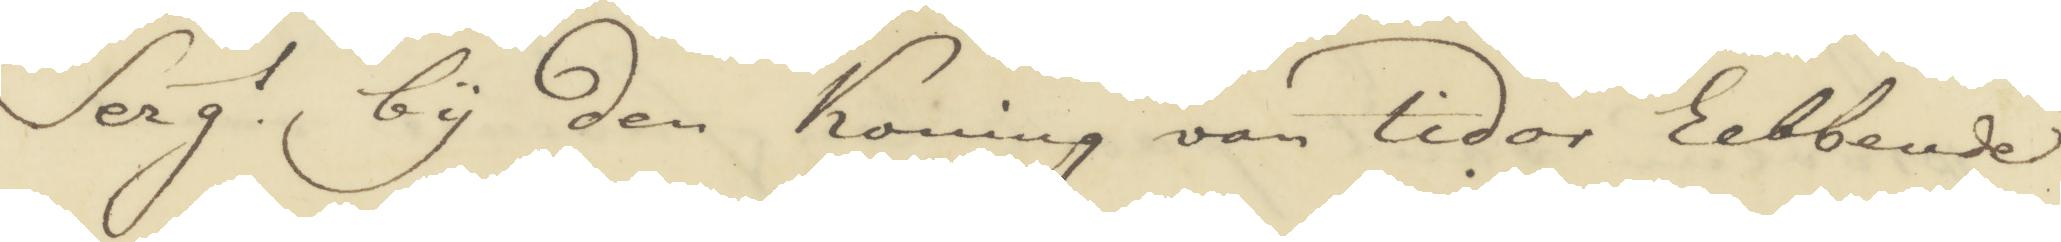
serg.t bij den koning van tidor hebbende
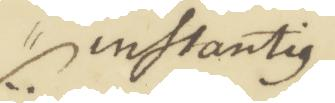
„ instantig
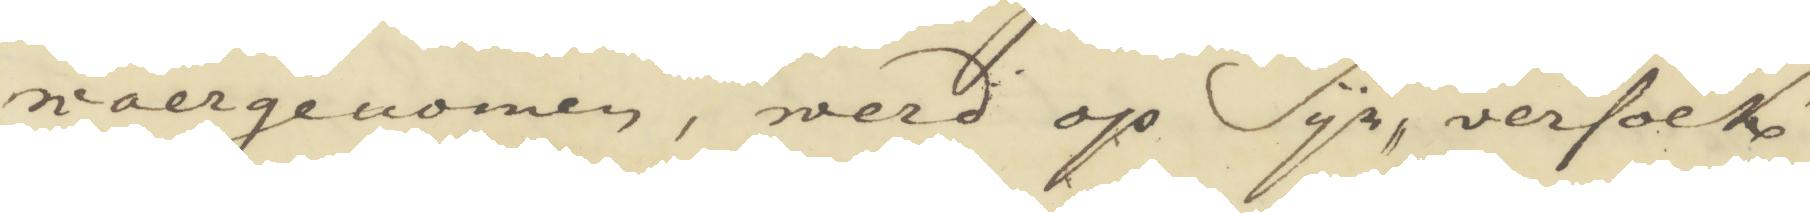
waergenomen, werd op sijn „ versoek
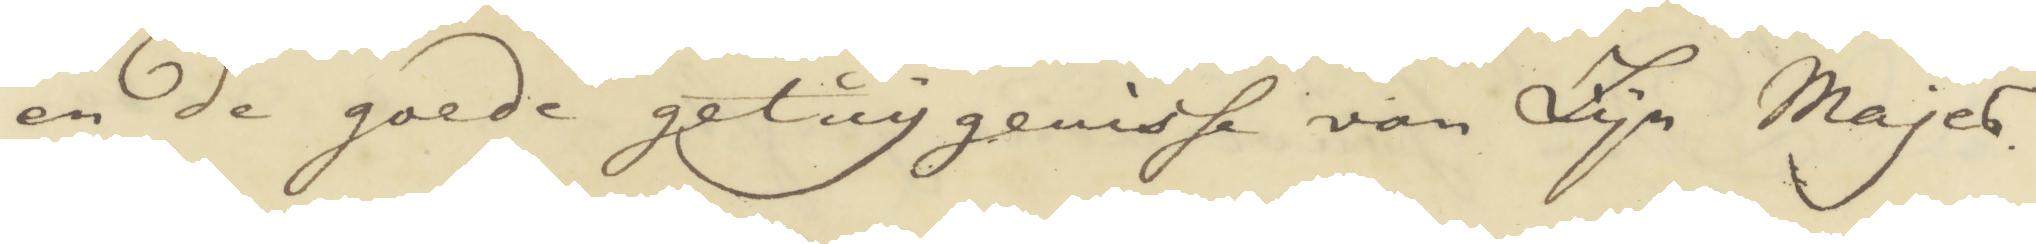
en de goede getuijgenisse van zijn Majes.
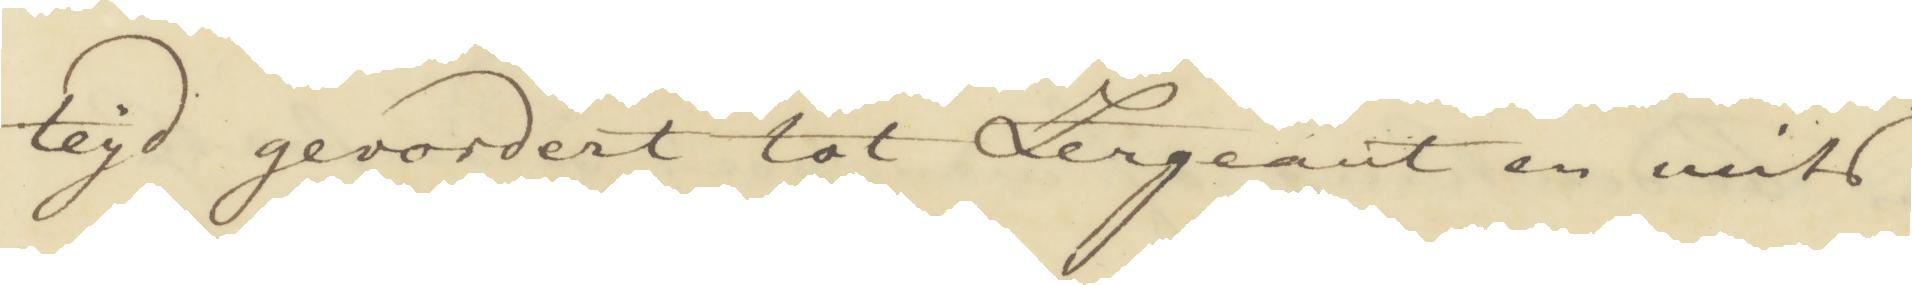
teijd gevordert tot zergeant en mits
